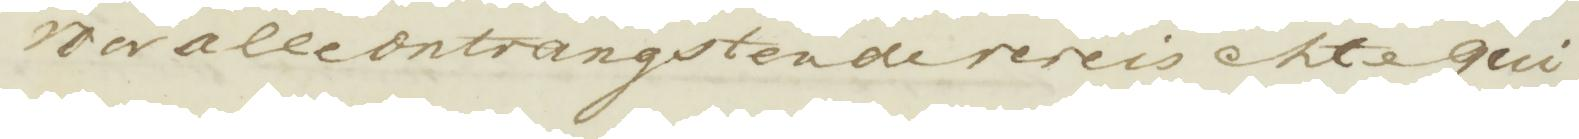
voor alle ontvangsten de vereischte qui
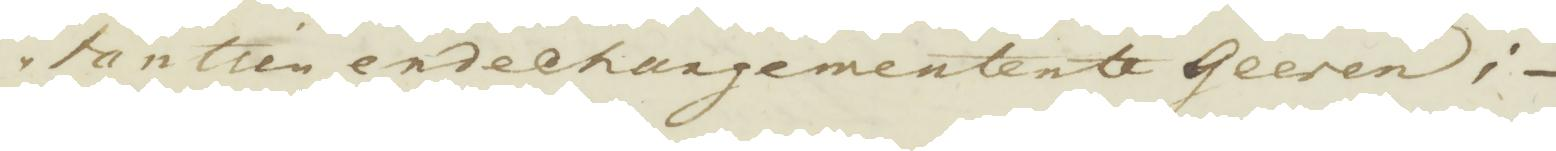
„tantien en dechangementen te geeven;-
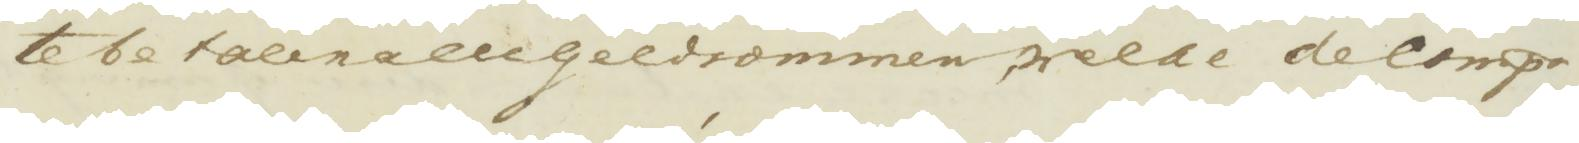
te be talen alle geldsommen, welke de compa
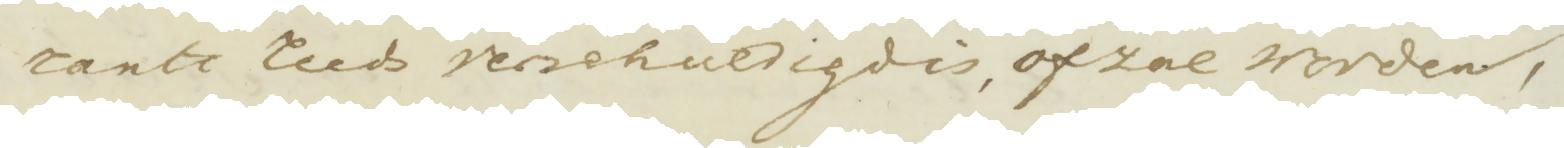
rante reeds verschuldigd is, of zal worden,
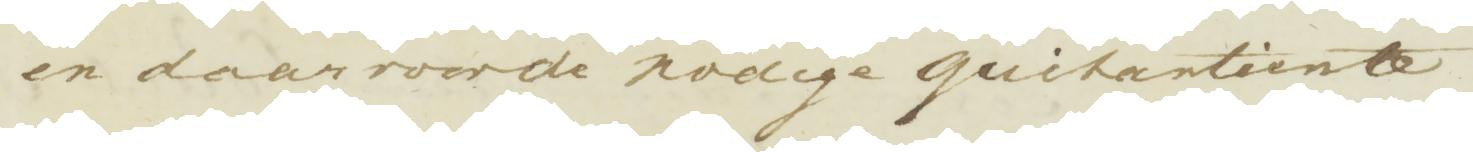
en daar voorde nodige quitantien te
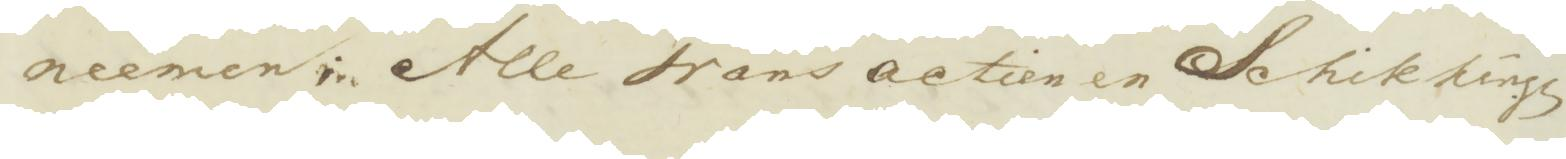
neemen in Alle Transactien en Schikkingen
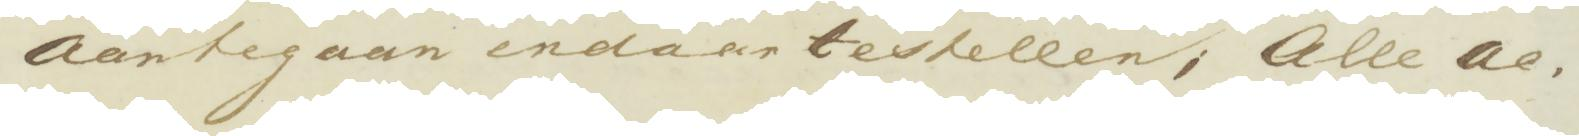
Aantegaan en daar testellen: alle ac„
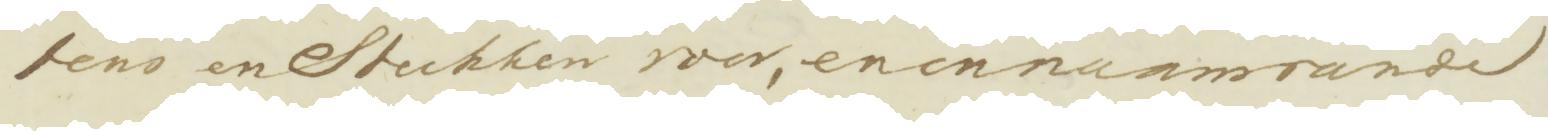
tens en Stukken voor, en in naam van de
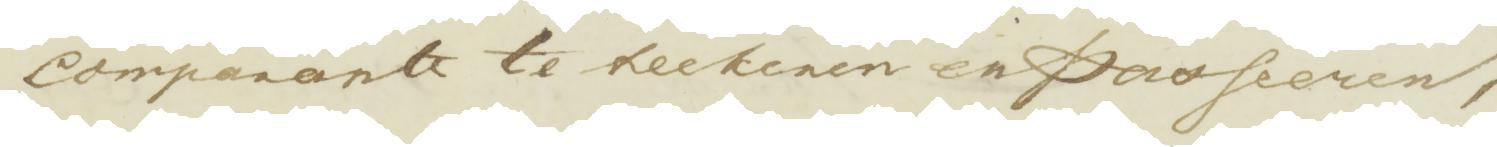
comparante te teekenen en Passeeren,
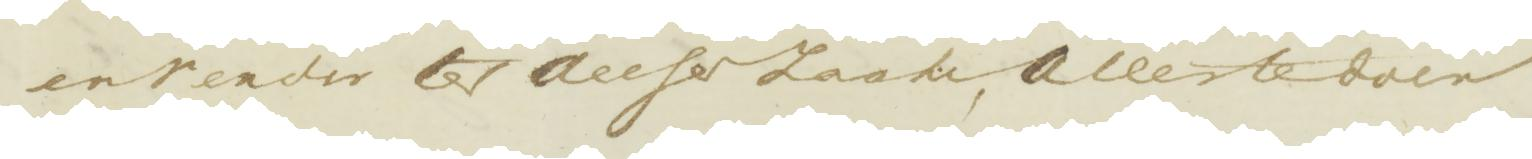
en verder ter deeser Zaake, alles te doen
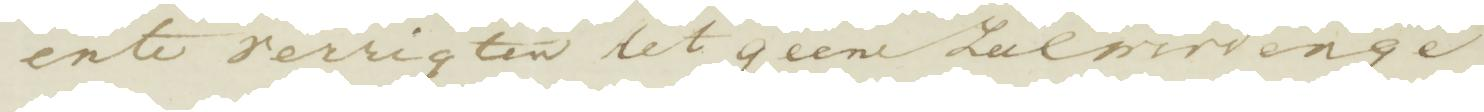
en te verrigten het geene Zal werden ge
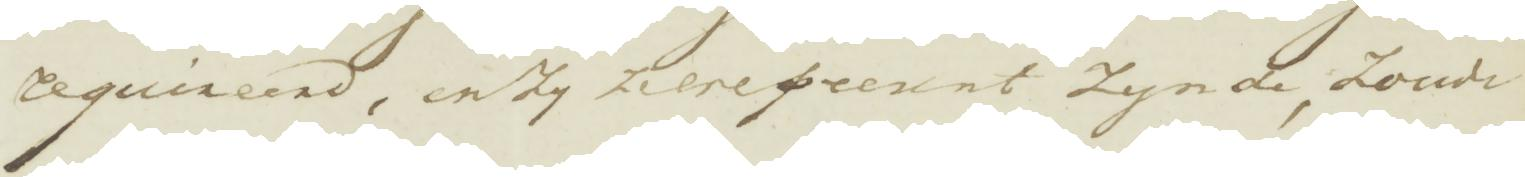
requireerd, en zy zelve present zynde, zoude
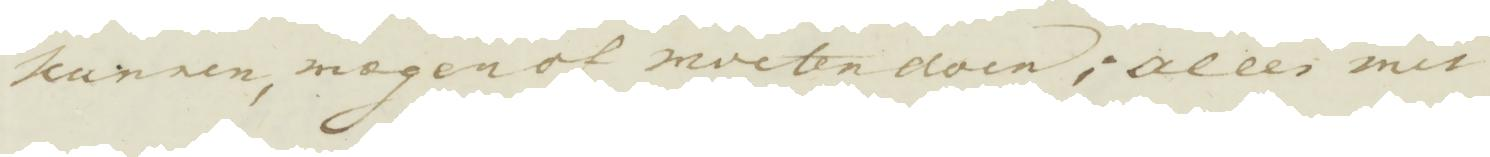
kunnen, mogen of moeten doen; alles met
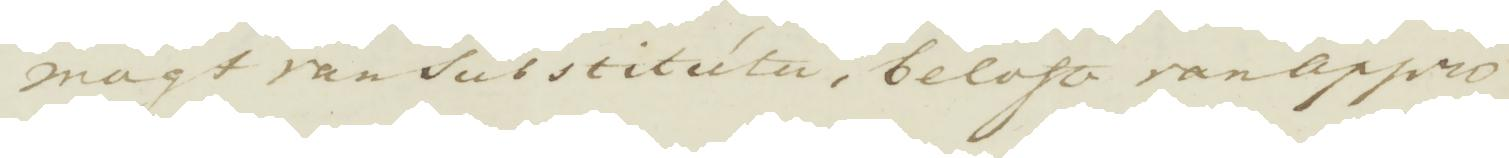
magt van substitutie, belofte van appro
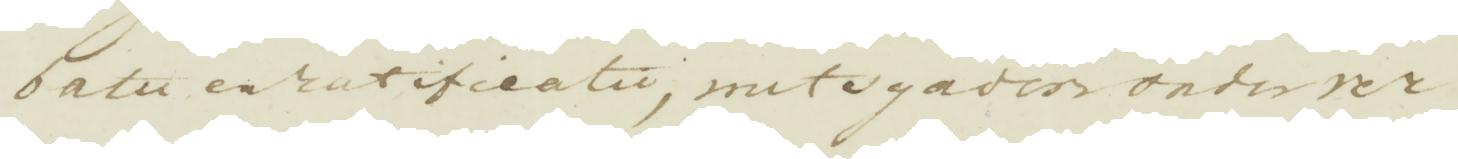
batie en ratificatie, mitsgaders onder ver
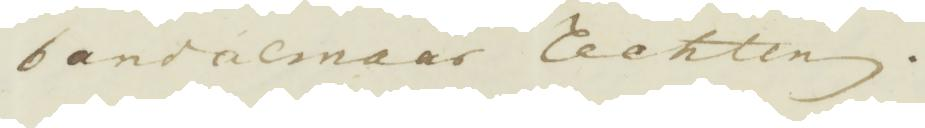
band alsnaar rechten.
